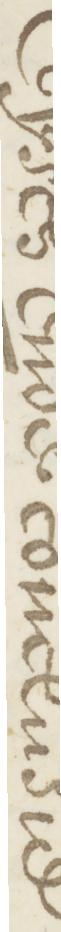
Eijsch ende conclusie
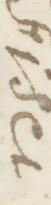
Fisci
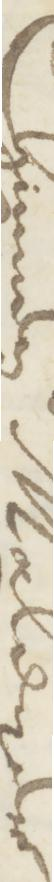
Chinesen Maleyer
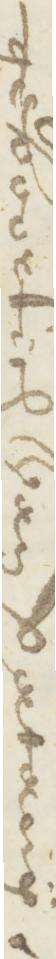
geboortich van patanij
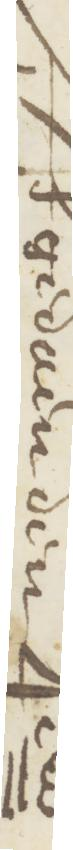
Afgedaen den 4=en
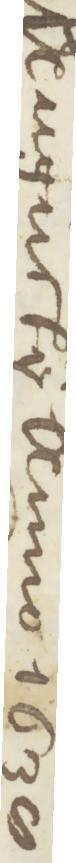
augustij anno 1638
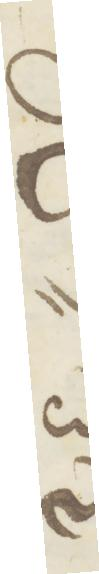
N=o 32
